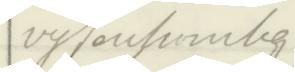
vyf entwintig
